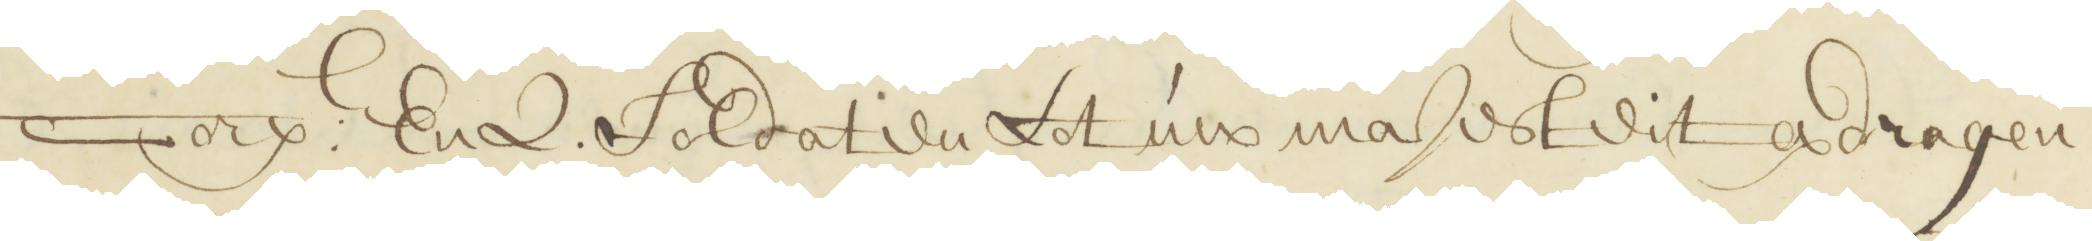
corp:l En 2. soldaten tot uw majesteit opdragen
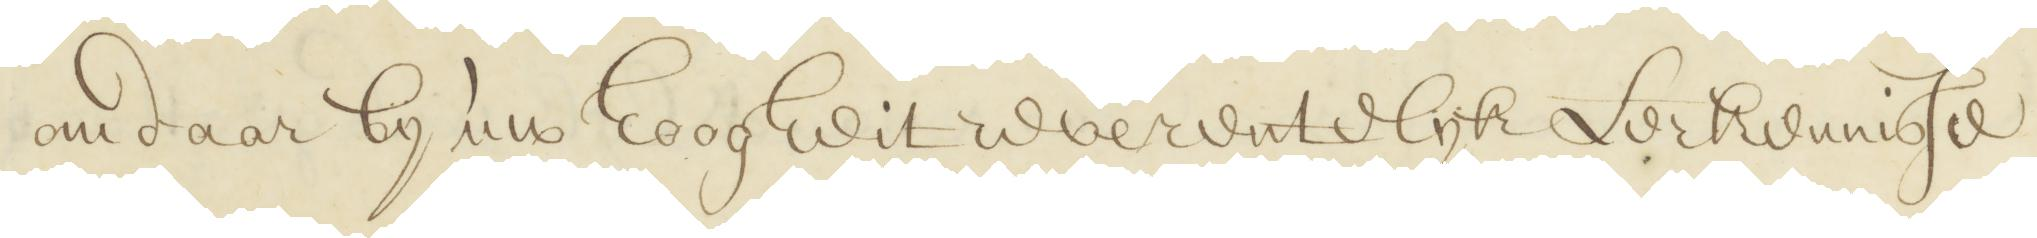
om daar bij uw hoogheit reverentelijk terkennisse
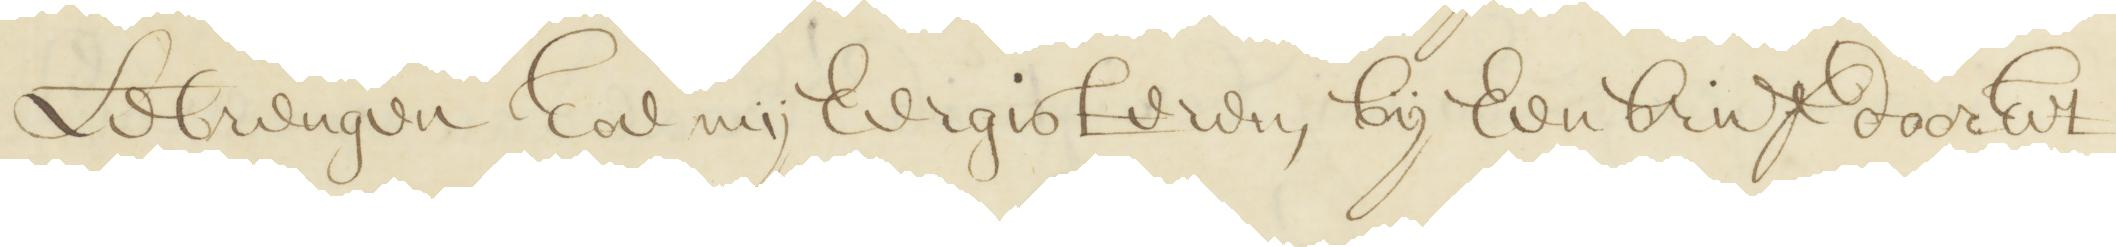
tebrengen hoe mij Eergisteren, bij Een brief door het
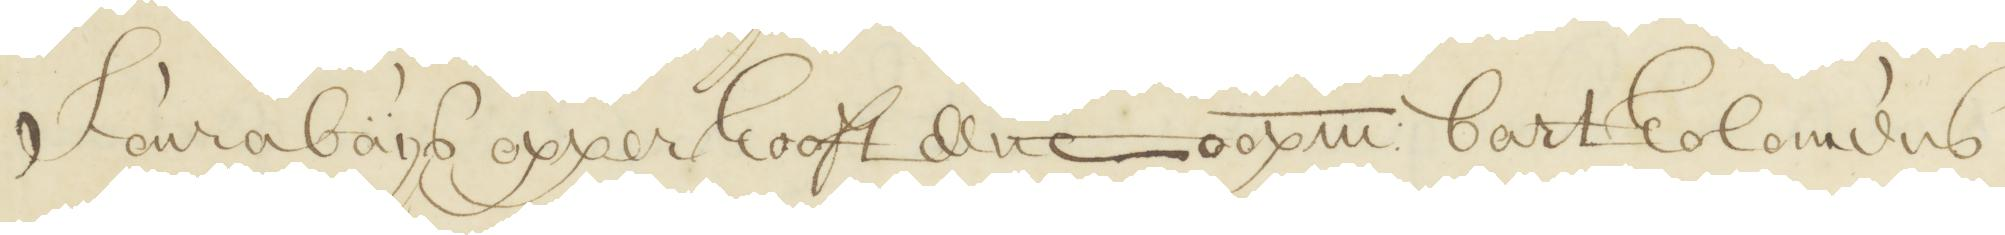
Sourabaijs opperhooft den coopm: bartholomeus
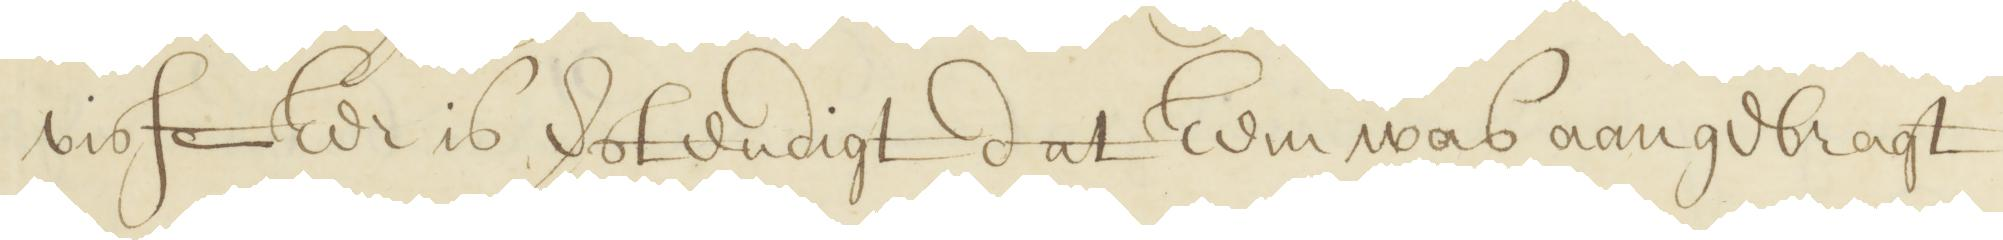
visscher is verstendigt dat hem was aangebragt
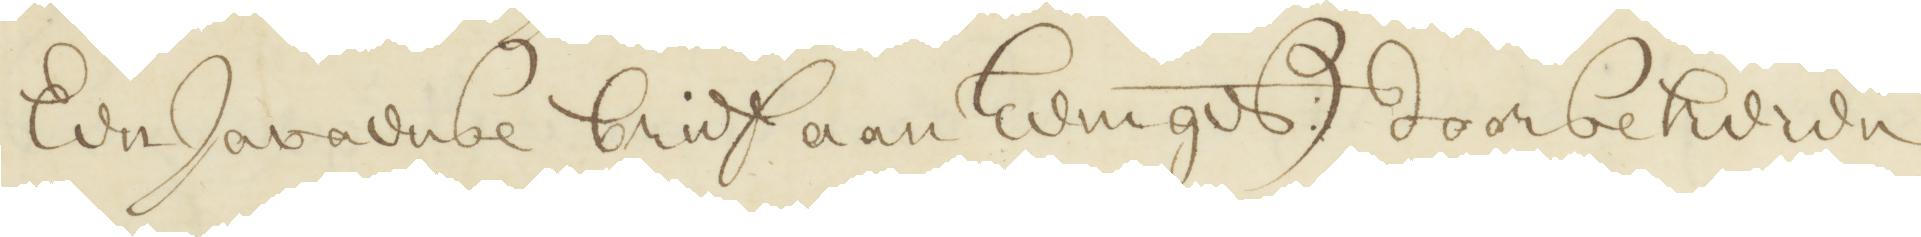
Een Javaense brief aan hem ges: doorbekeren
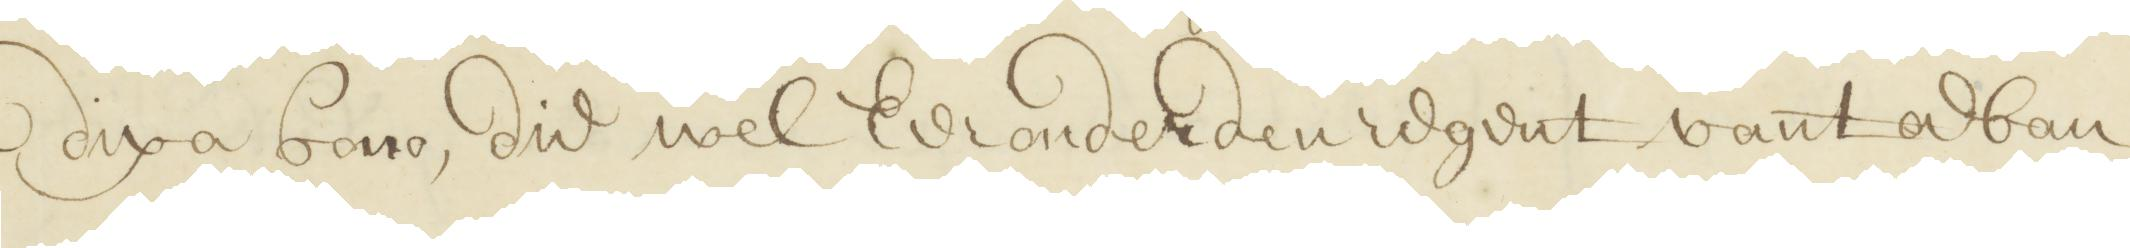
dipa ono, die wel Eeronder den regent vantoeban
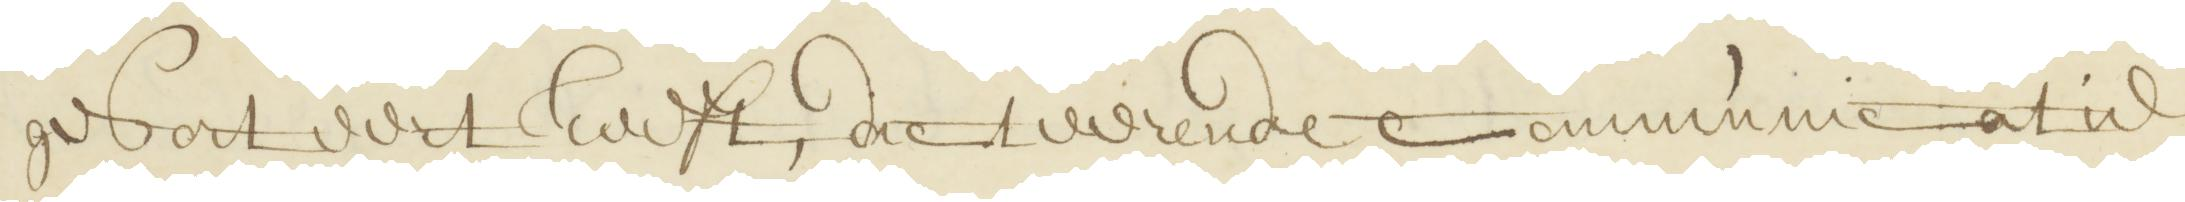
gesorteert heeft, dicteerende communicatie,
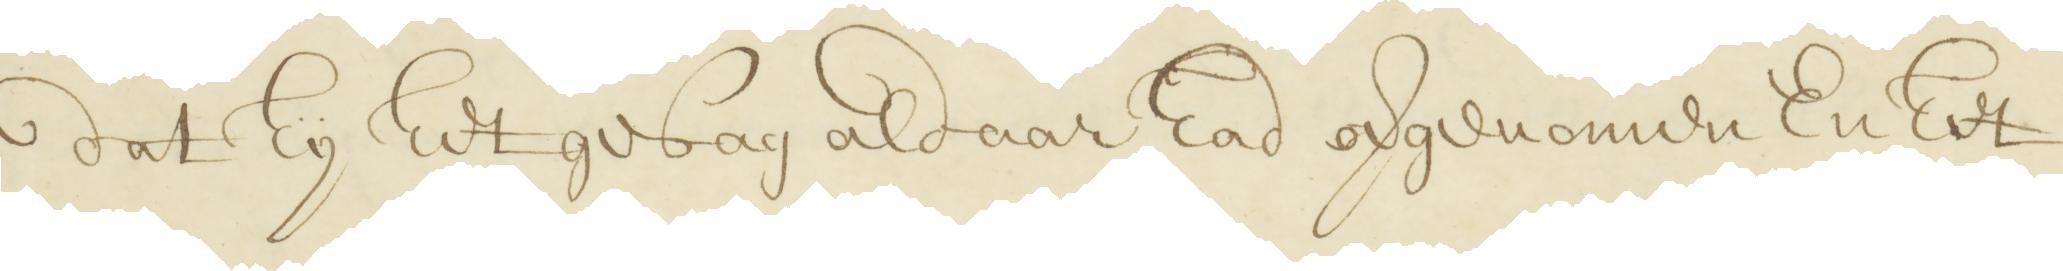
dat hij het gesag aldaar had overgenomen En het
